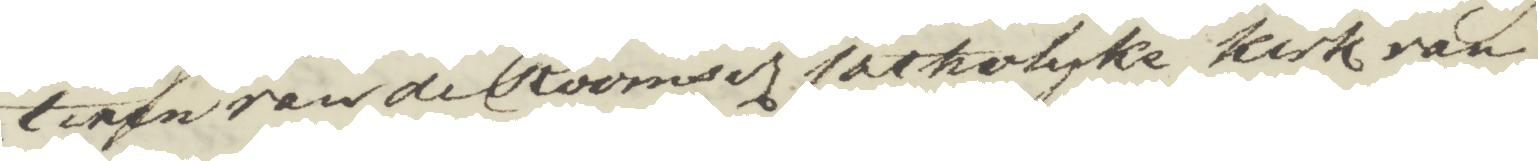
teren van de Roomsch Catholyke Kerk van
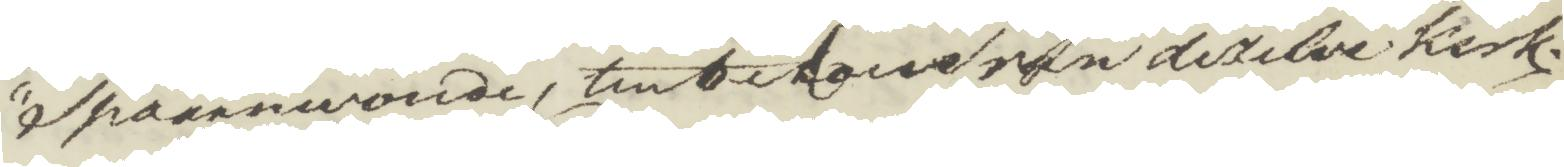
Spaarnwoude, ten behoeve van dezelve Kerk.
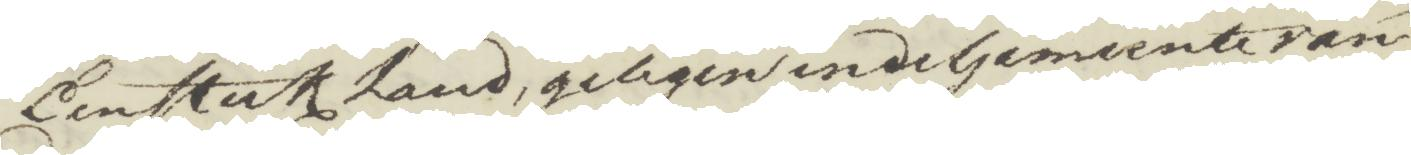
Een stuk Land, gelegen in de Gemeente van
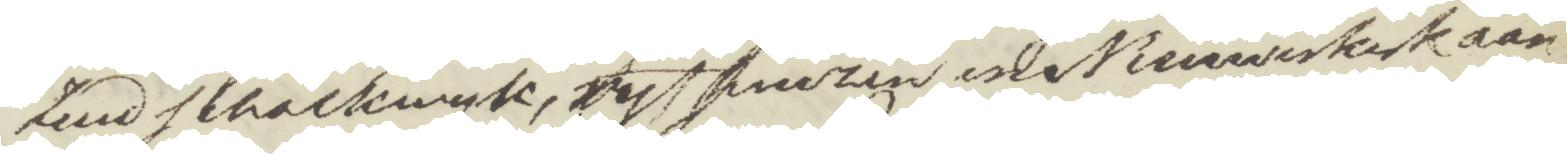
zuid schalkwyk, vyf huizen in Nieuwerkerk aan
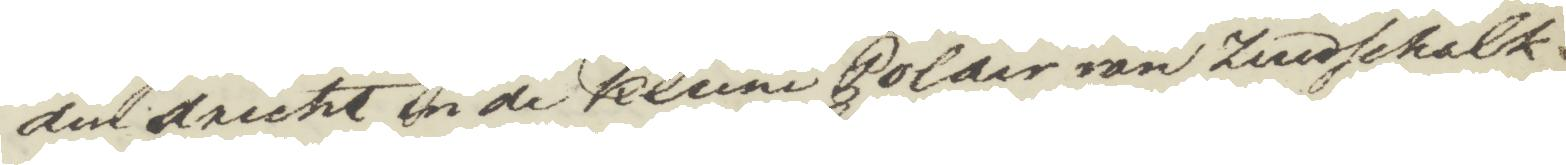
den drecht in de kleine Polder van Zuidschalk
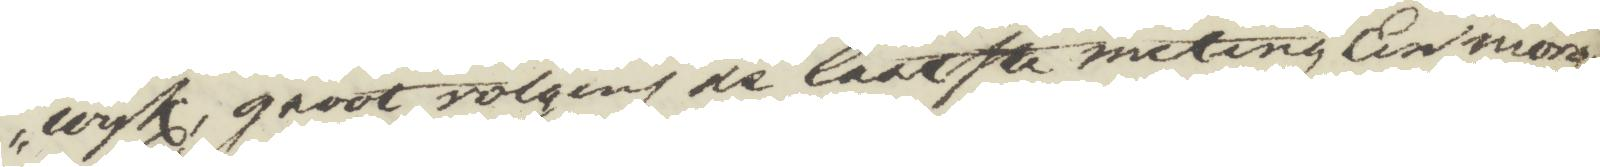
„wyk, groot volgens de laatste meting, Een morgen
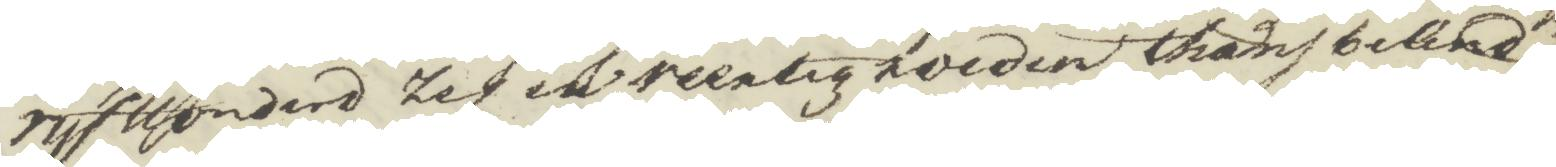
vyf Honderd zes in veertig roeden, thans belend
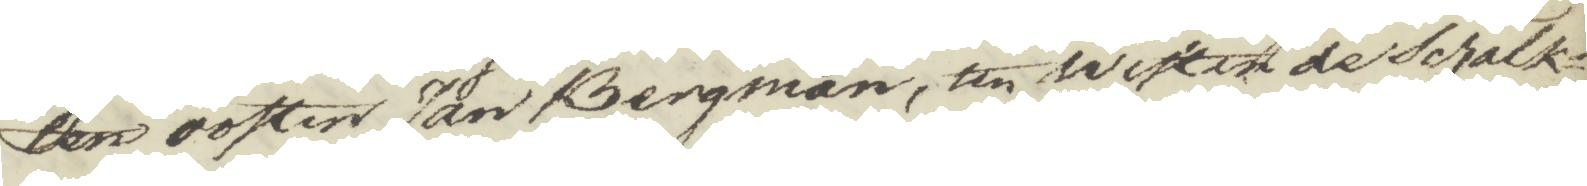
ten oosten Jan Bergman, ten westen de schalk=
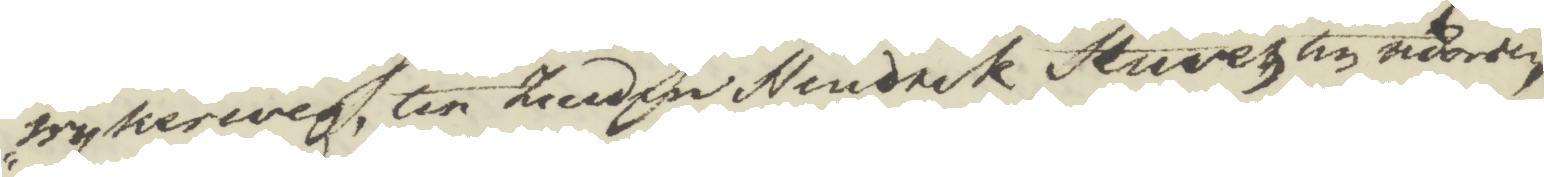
„wykerweg, ten zuiden Hendrik Huven ten noorden
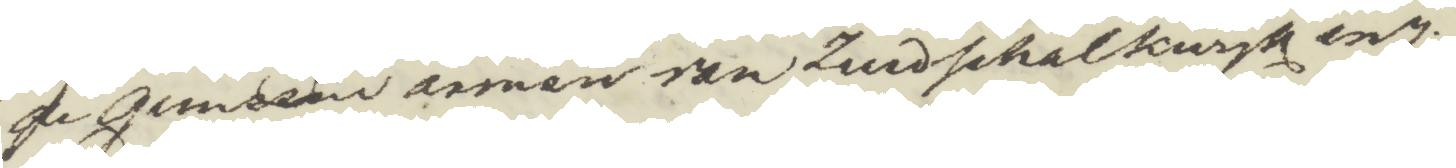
de Gemeen armen van Zuidschalkwyk enz:
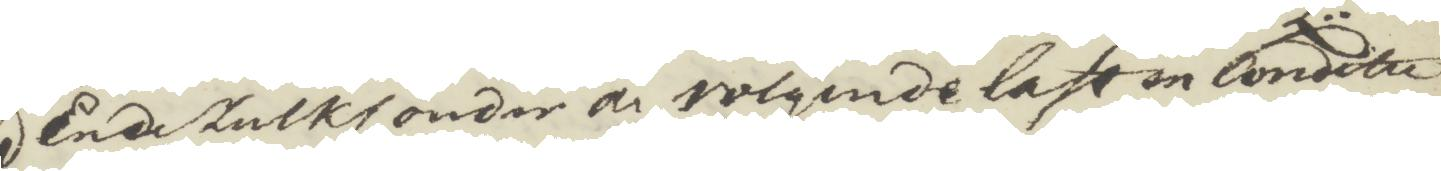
Ende zulks onder de volgende last en conditie
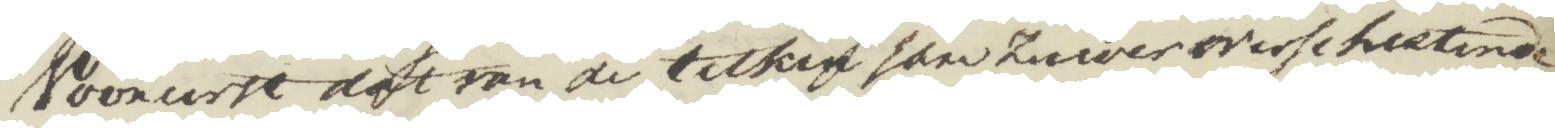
Vooreerst dat van de telken Jare zuiver overschietende
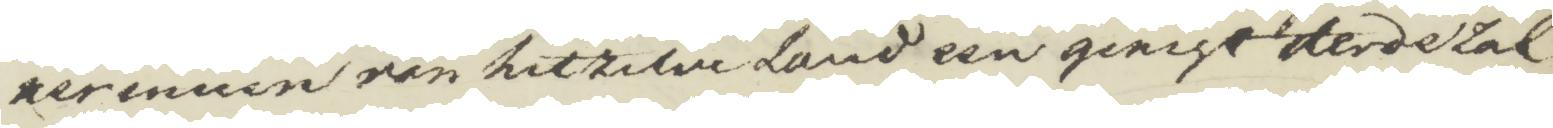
verinnen van hetzelve Land een geregt derde zal
